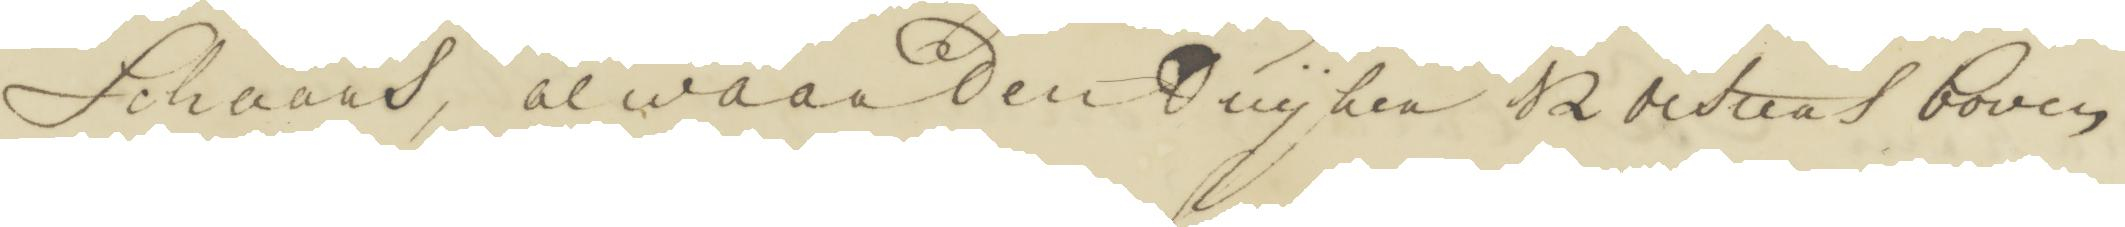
schaars, alwaar den duijker 12 oesters boven
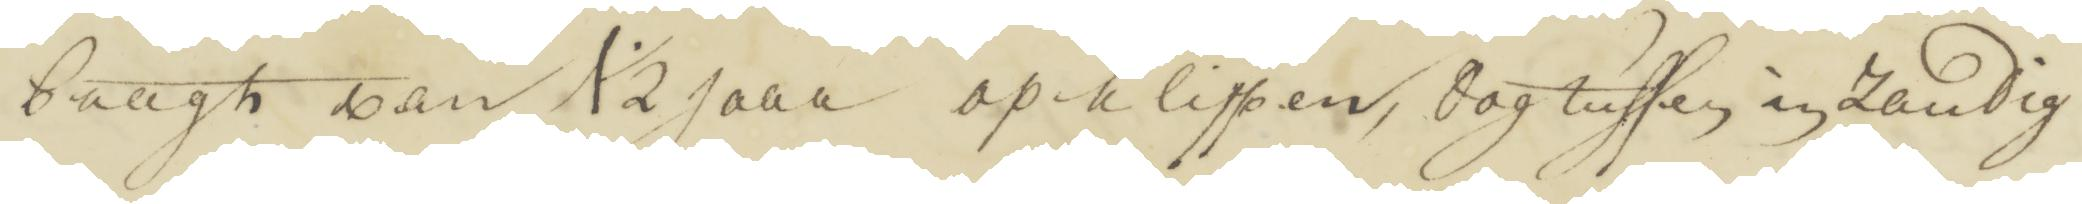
bragt van 1½ jaar op klippen, dog tussen in zandig
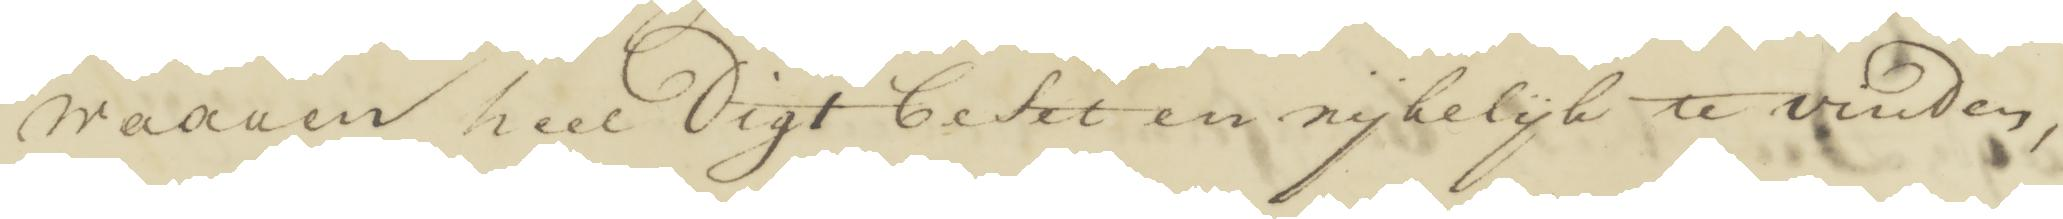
waaren heel digt beset en rijkelijk te vinden,
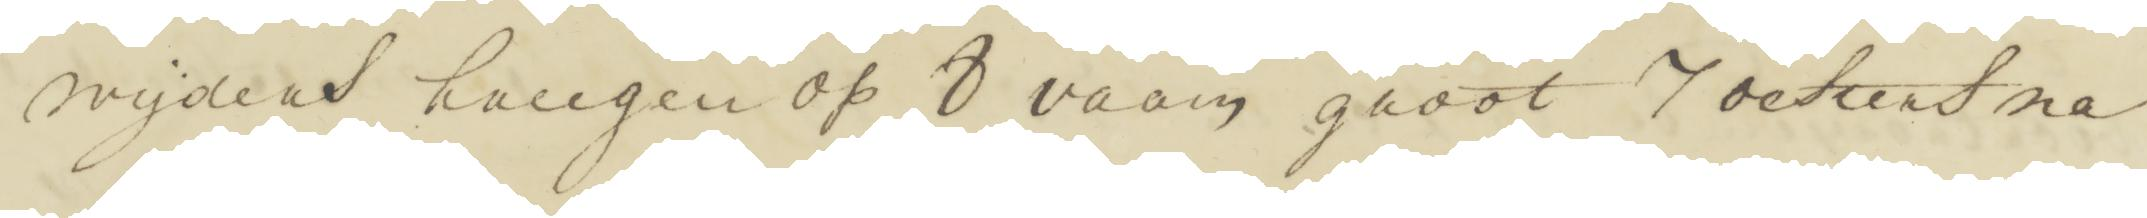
wijders kreegen op 8 vaam groot 7 Oesters na
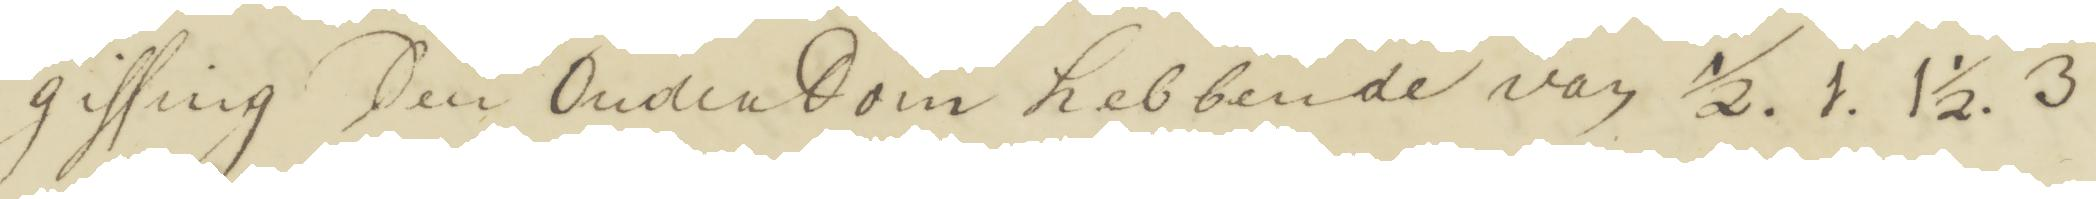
gissing den Ouderdom hebbende van ½. 1. 1½. 3
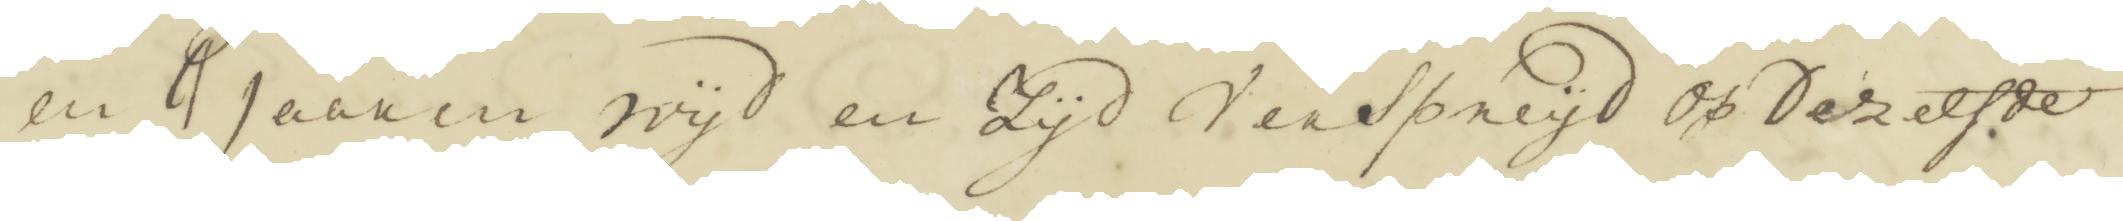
en 4 Jaaren wijd en zijd verspreijd op dezelfde
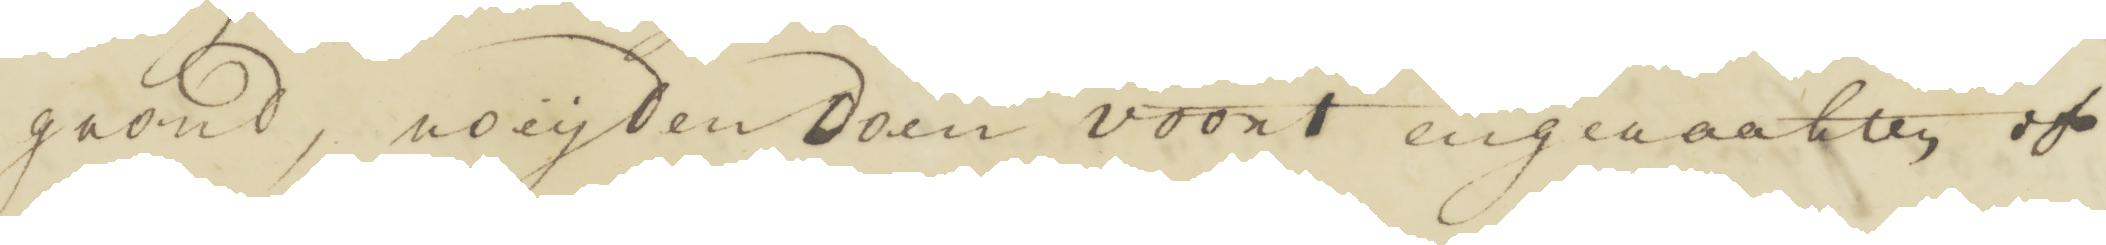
grond, roeijden doen voort en geraakten op
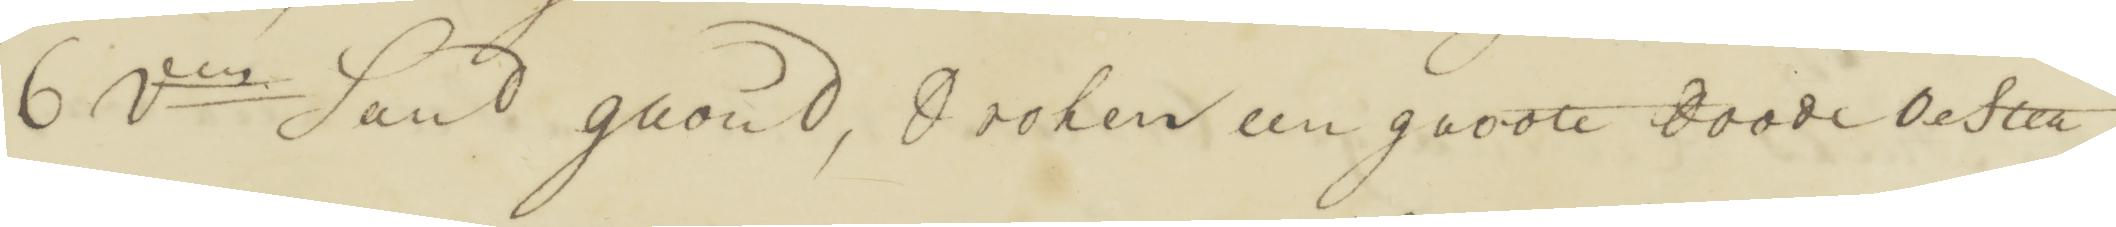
6 V=m Land grond, dooken een groote doode Oester
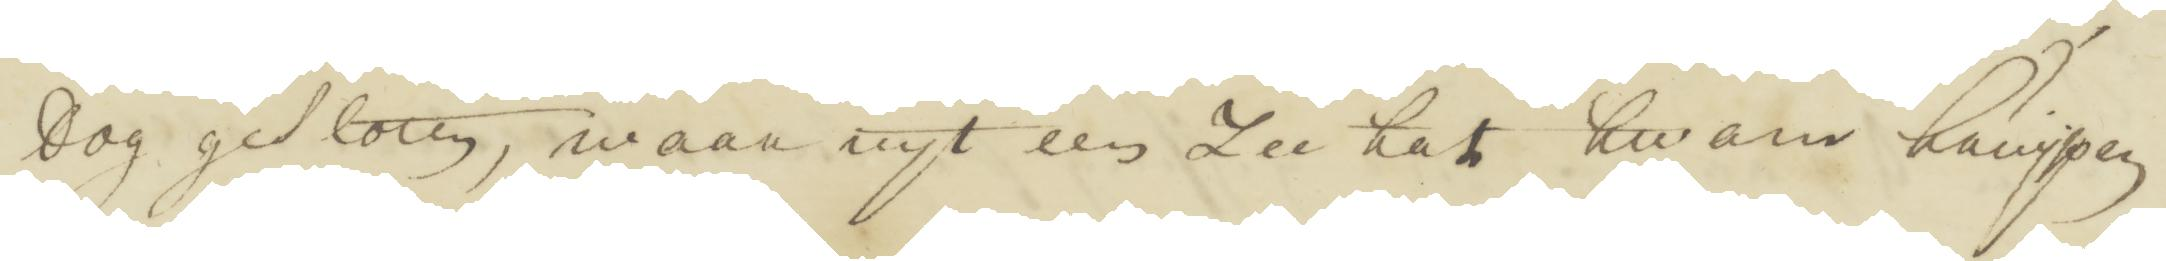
dog gesloten, waar uyt een zee kat kwam kruijpen
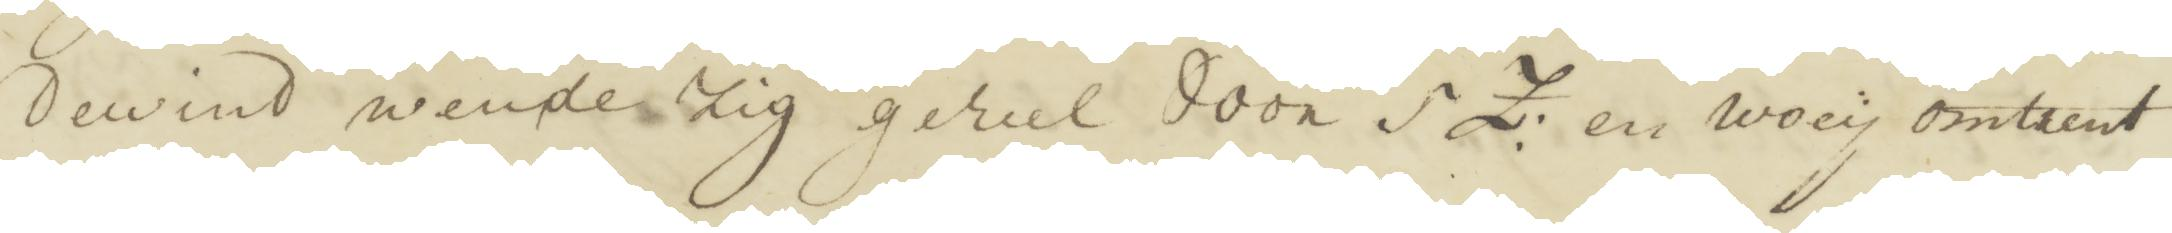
dewind wende zig geheel door 5 Z: en woeij omtrent
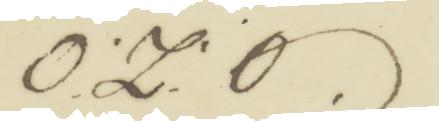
O: Z: O
